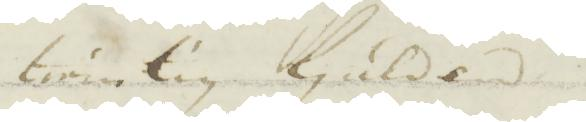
twintig Gulden
